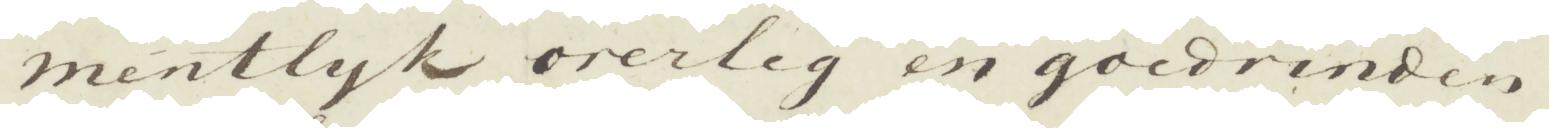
mentlyk overleg en goedvinden
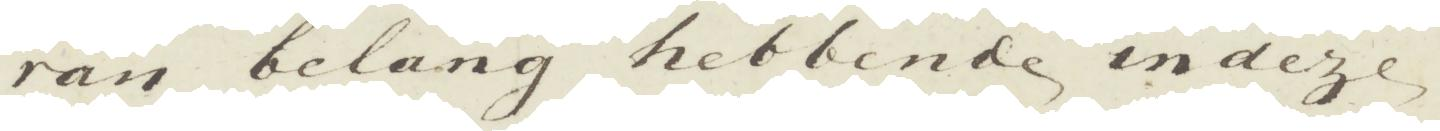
van belang hebbende in deze
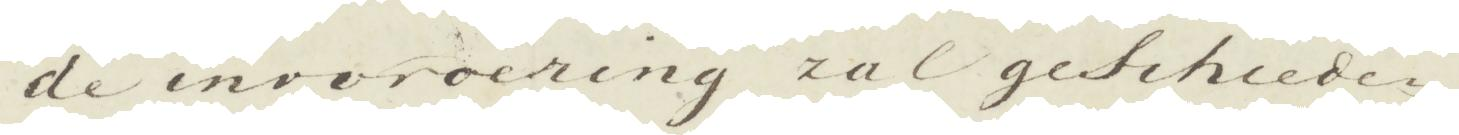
de invordering zal geschieden
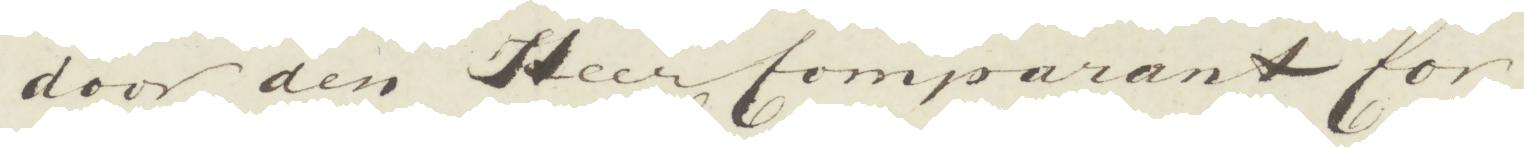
door den Heer Comparant Cor
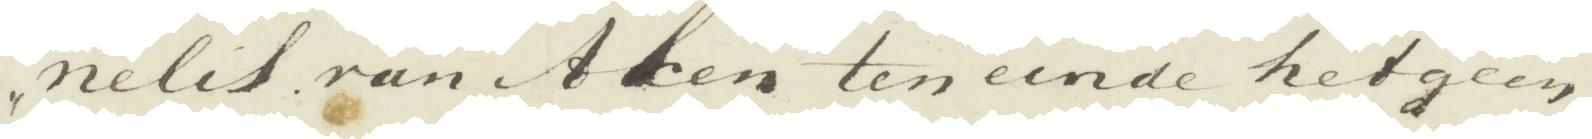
„nelis van Aken ten einde het geen
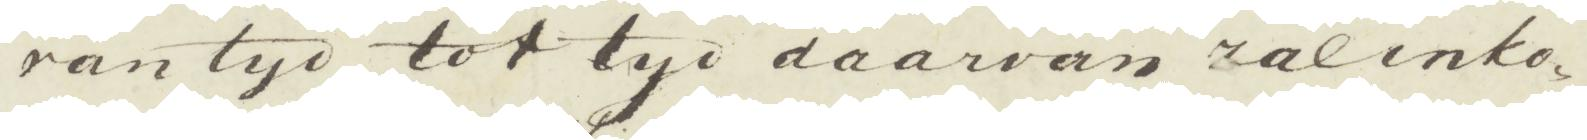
van tyd tot tyd daarvan zal inko„
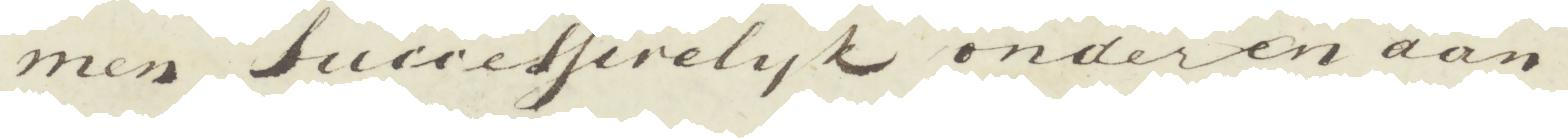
men Successivelyk onder en aan
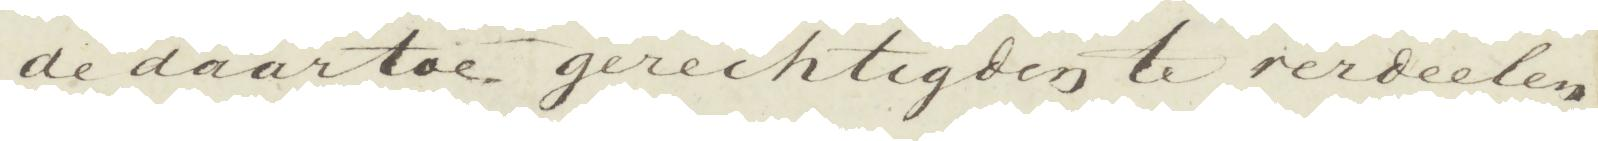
de daartoe gerechtigden te verdeelen
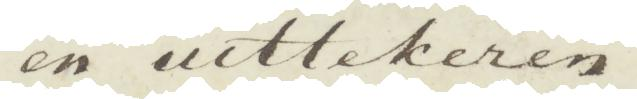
en uit te keren
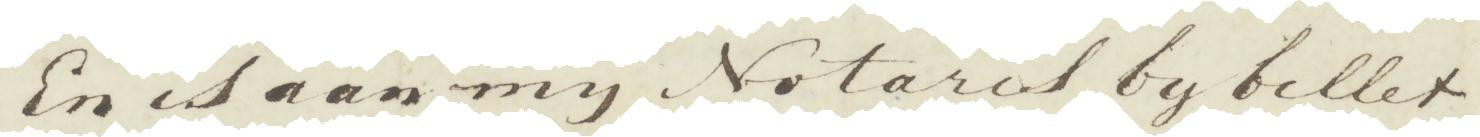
En is aan my Notaris by billet
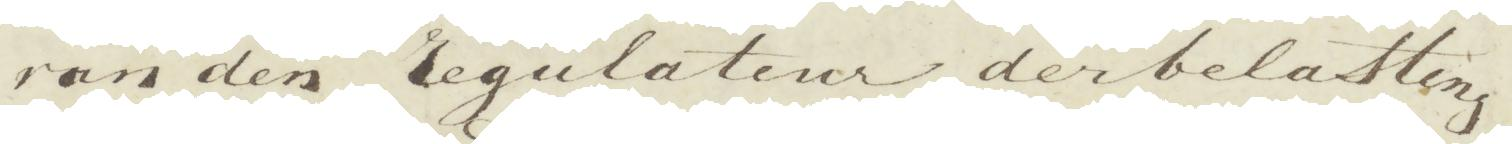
van den regulateur der belasting
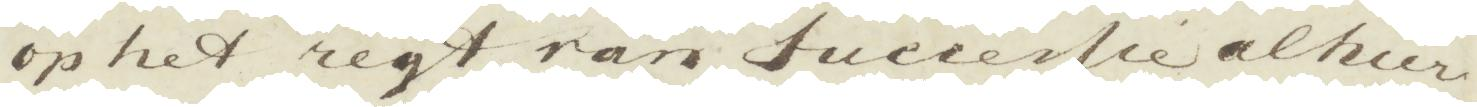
op het regt van Successie alhier
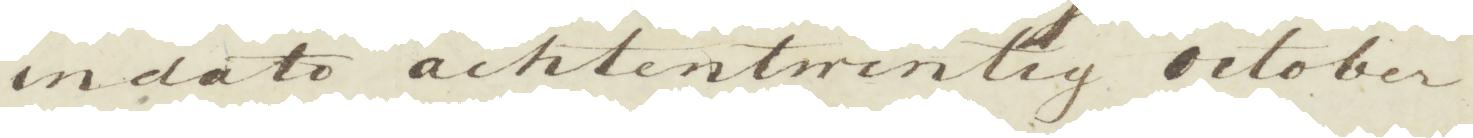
in dato achtentwintig october
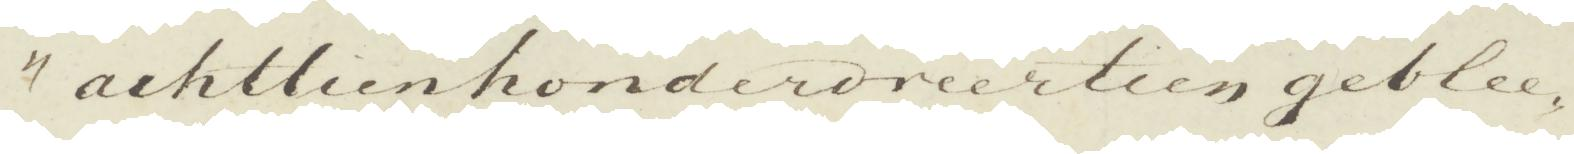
„achttien honderd veertien geblee„
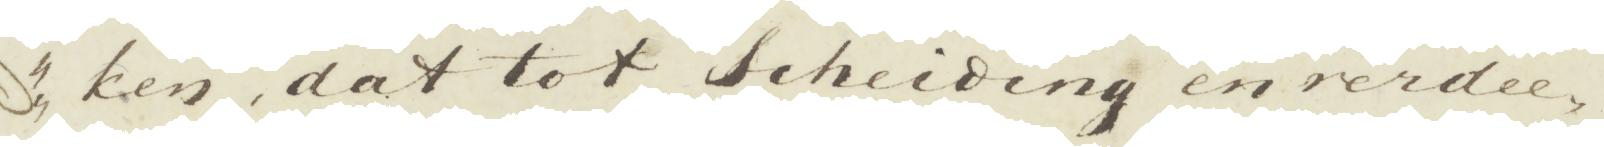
„ken, dat tot scheiding en verdee„
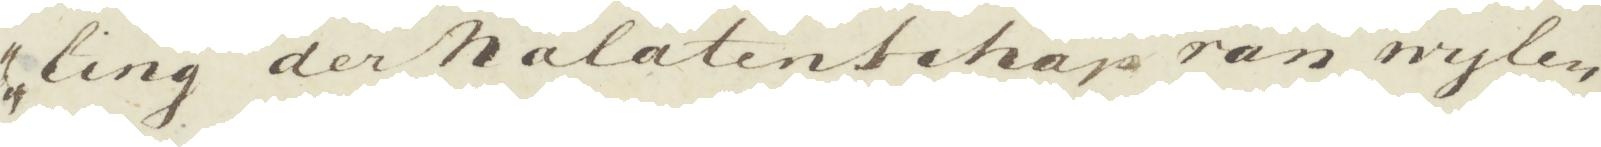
„ling der Nalatenschap van wylen
